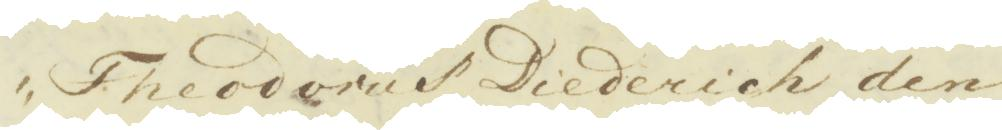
„ Theodorus Diederich den
